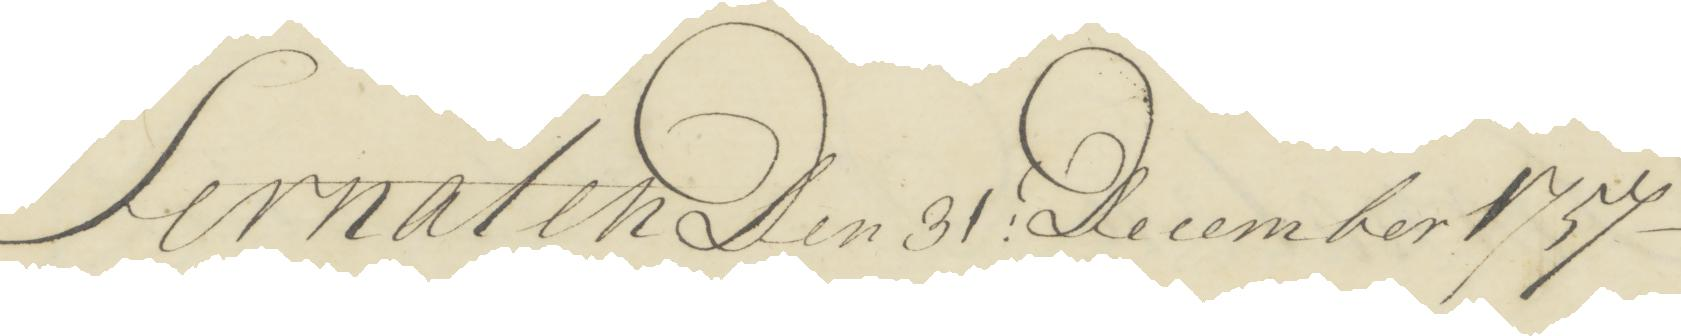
Ternaten Den 31:e December 1757
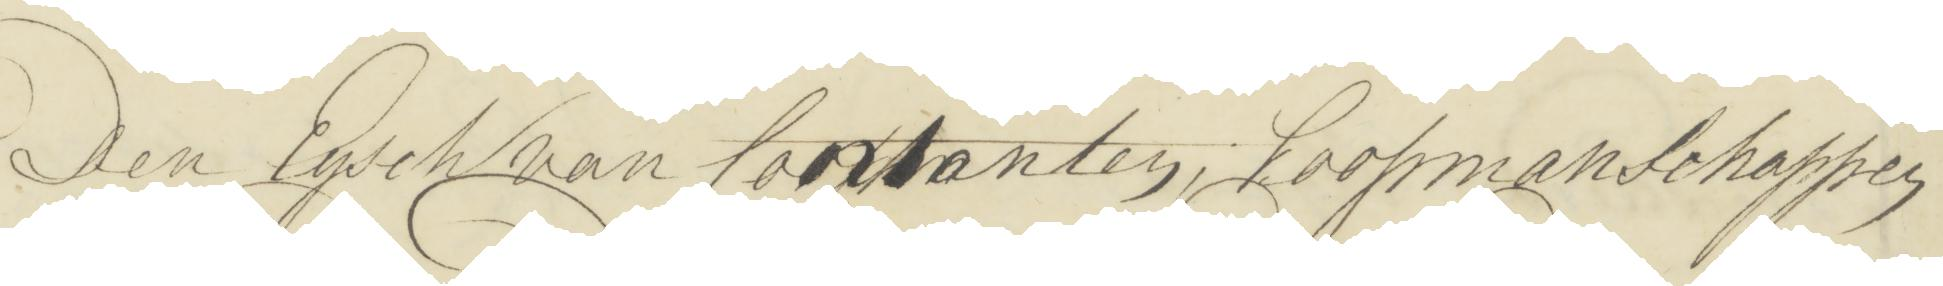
Den Eyssch van Contanten, koopmanschappen
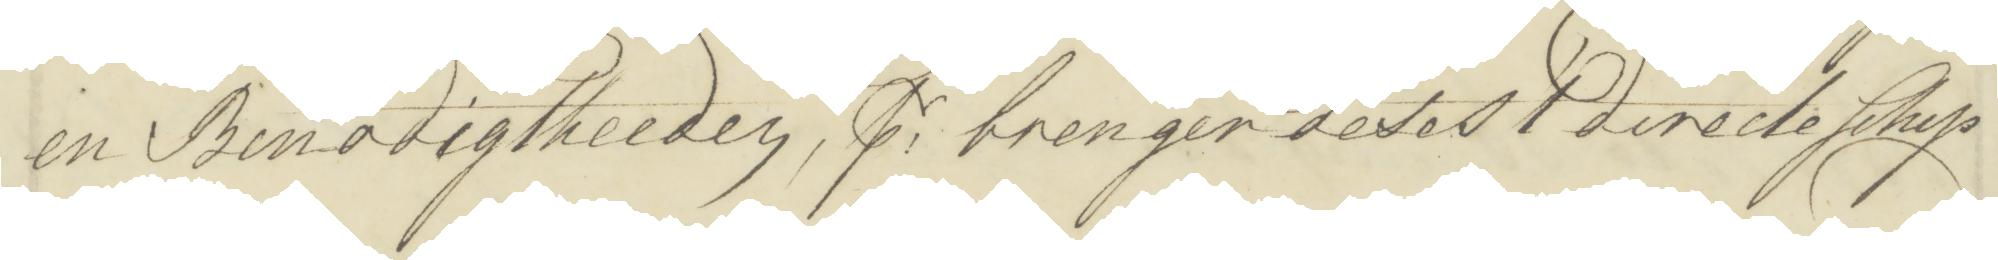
en Benodigtheeden, p:r brenger deses ’t directe schip
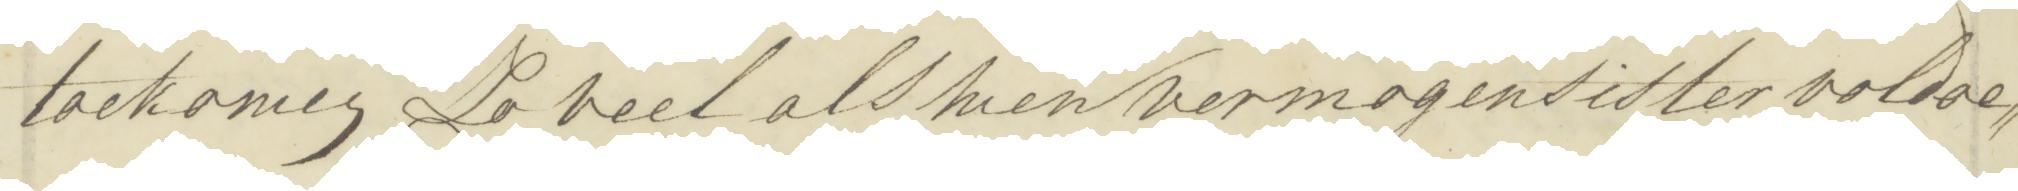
toekomen so veel als men vermogens is ter voldoe„
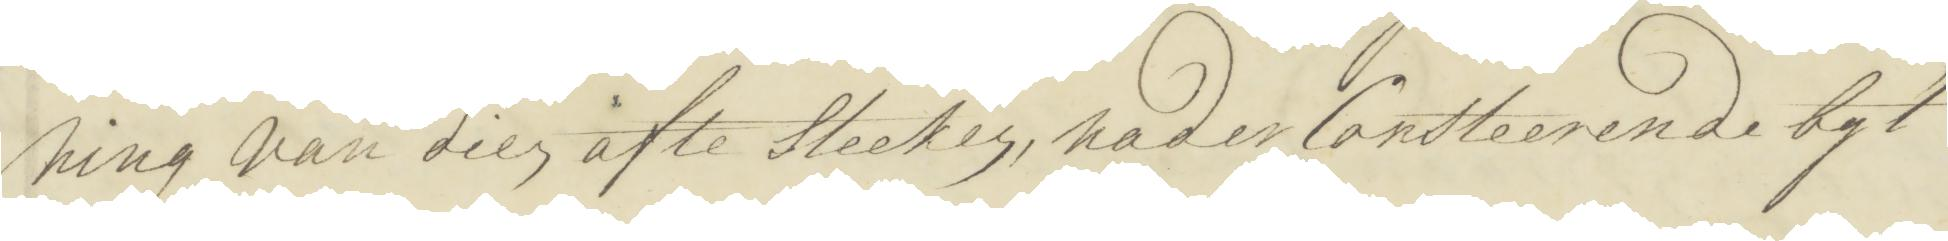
ning van dien afte steeken, nader Consteerende by 't
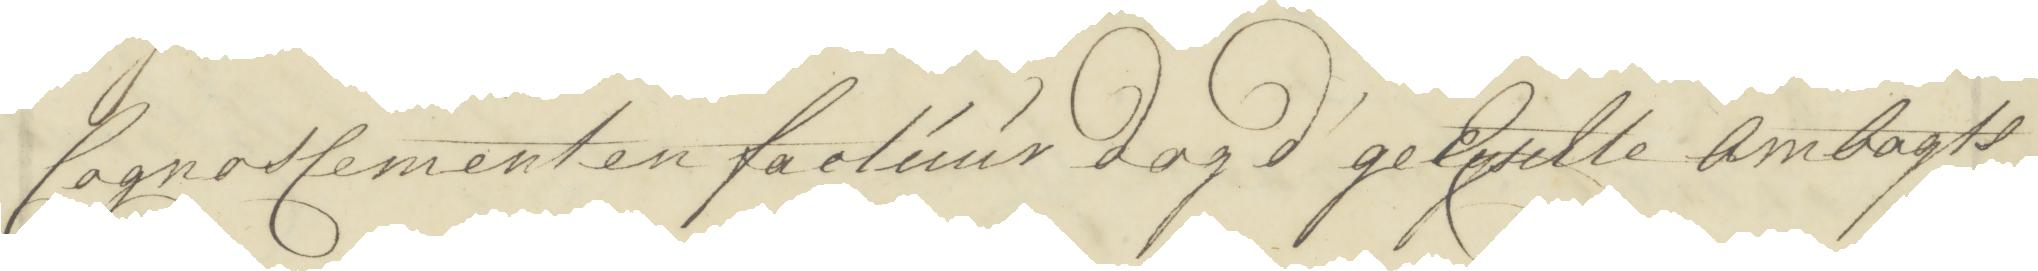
CognosCementen factuur dog d’ geEyschte ambagts
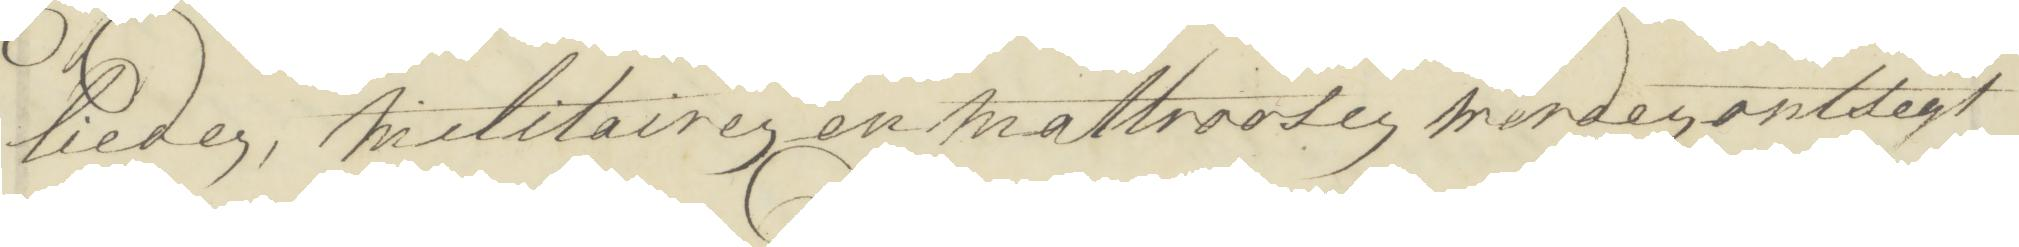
lieden, militairen en mattroosen werden ontsegt
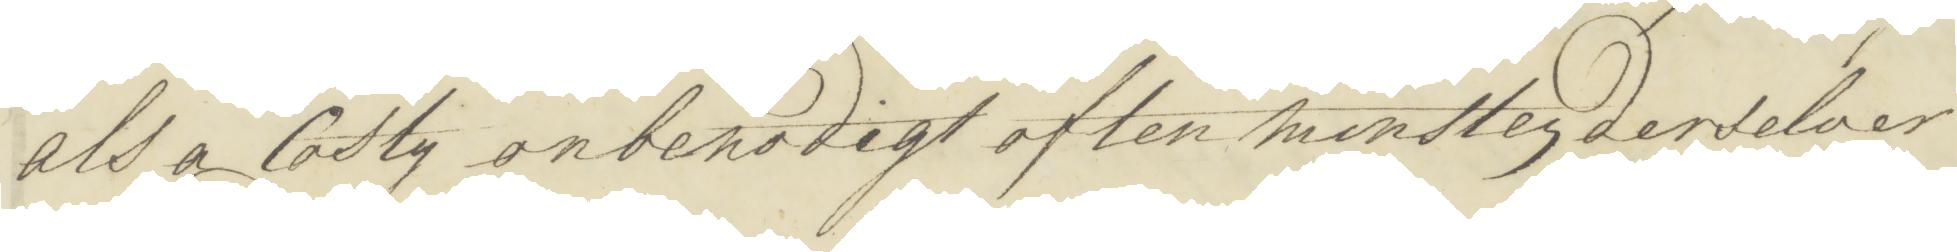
als a Costy onbenodigt of ten minsten derselver
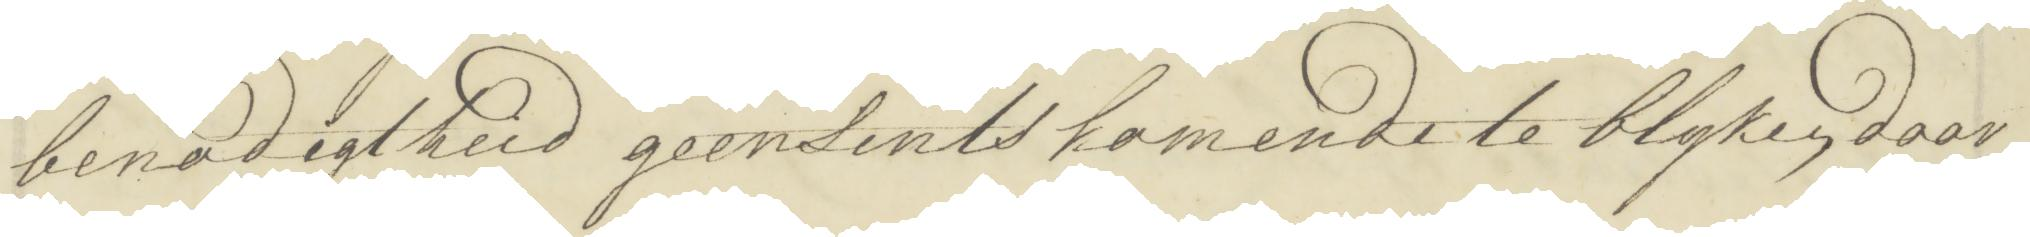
benodigtheid geensints komende te blyken door
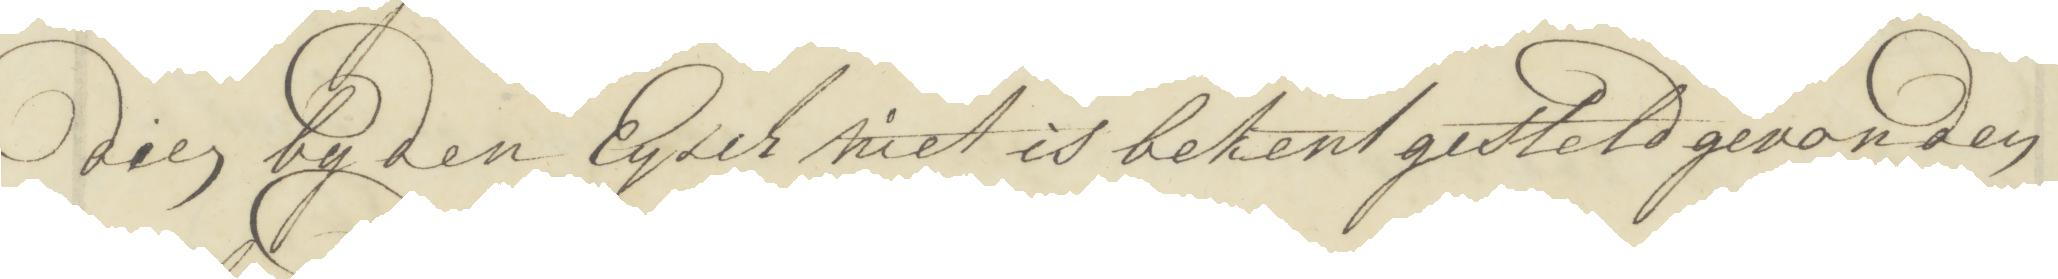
dien by den Eysch niet is bekent gesteld gevonden
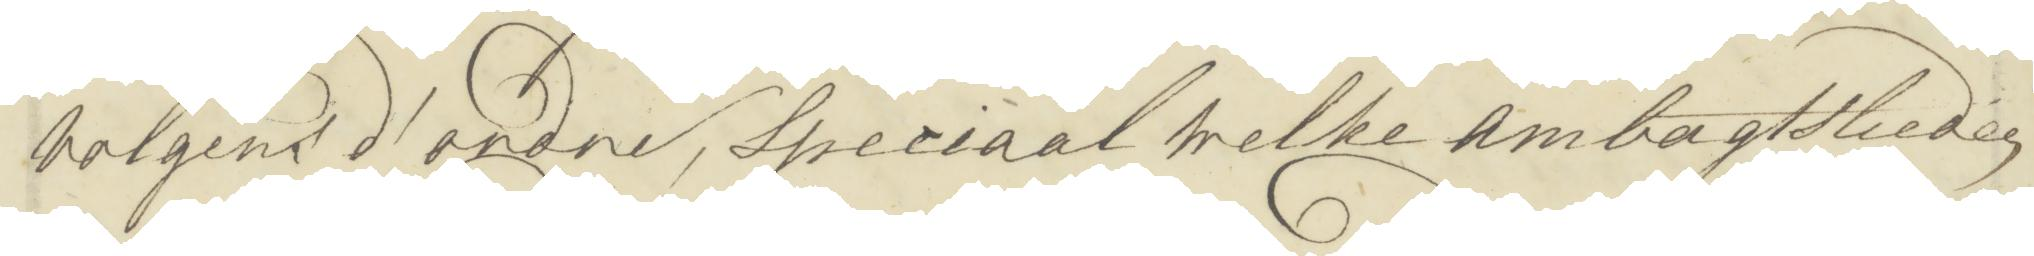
volgens d’ordre, speciaal welke ambagtslieden
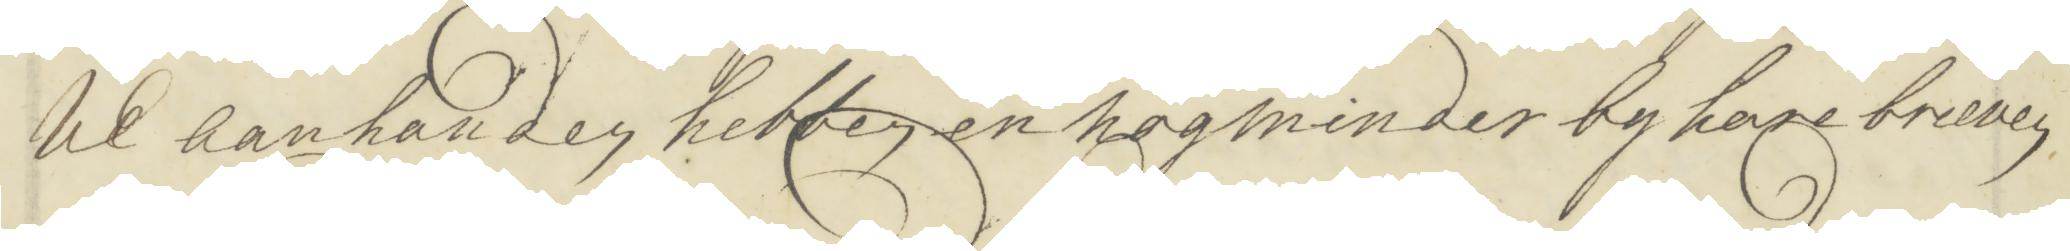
UE aanhanden hebben en nog minder by hare brieven
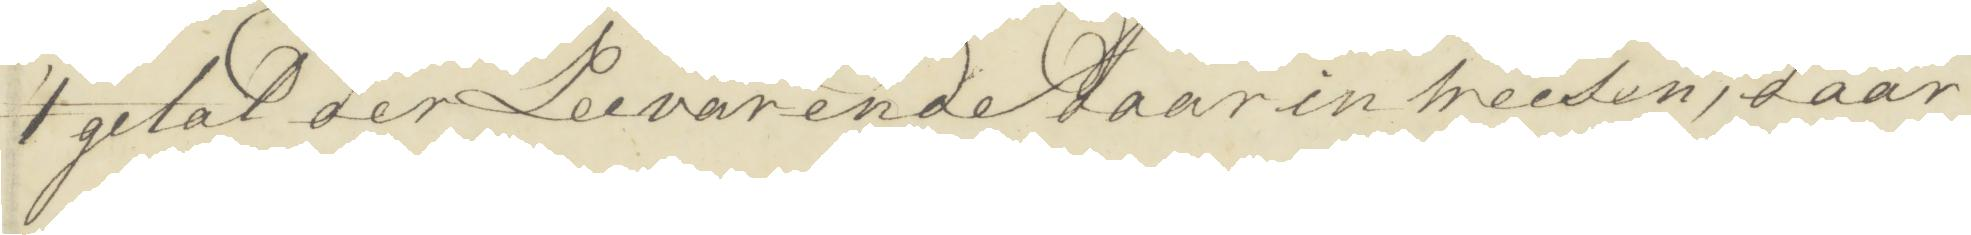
’t getal der zeevarende daar in weesen, daar
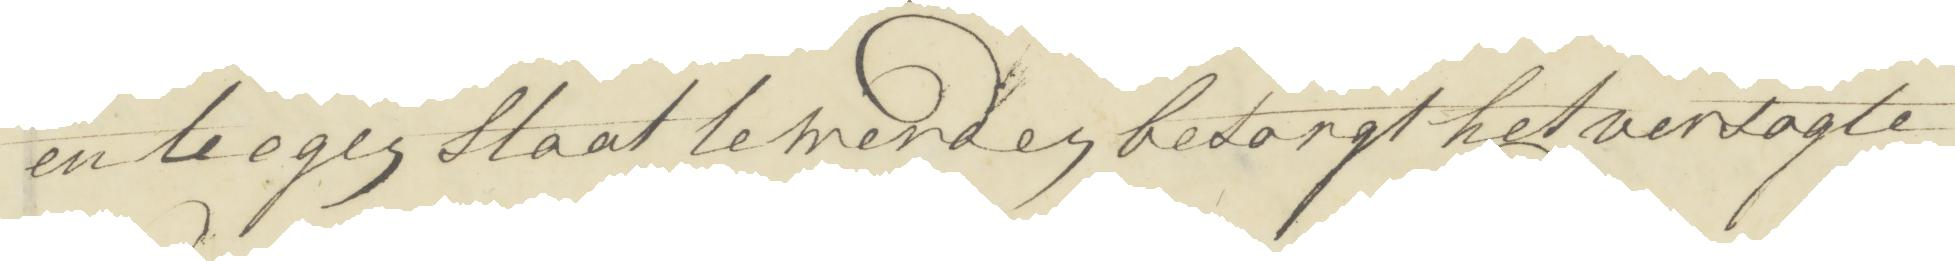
enteegen staat te werden besorgt het versogte
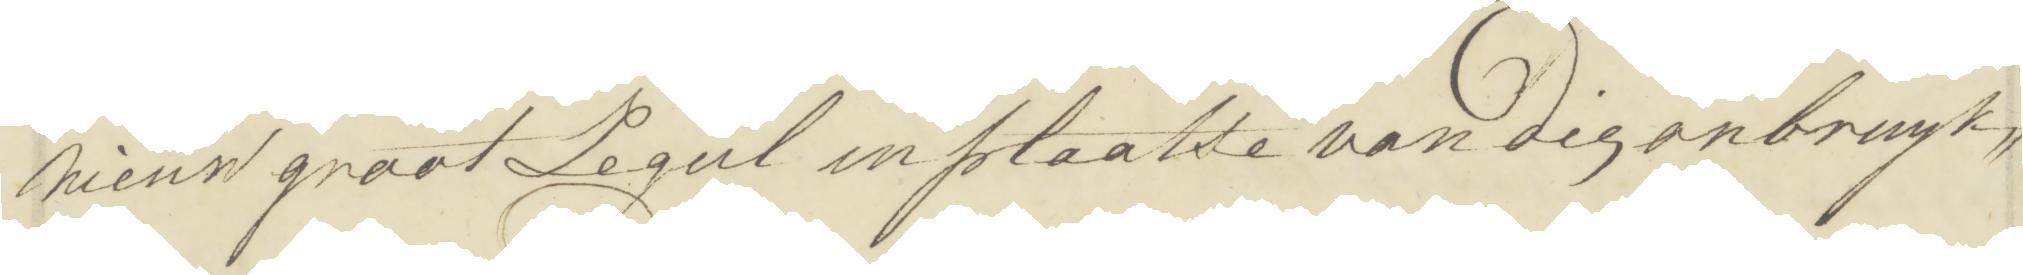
nieuw groot zegul in plaatse van dien onbruyk„
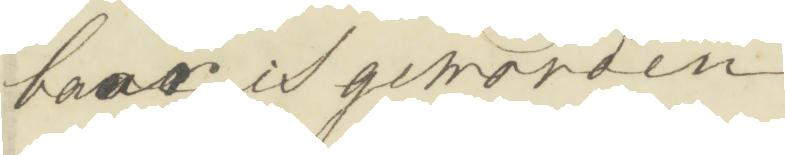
baar is geworden
